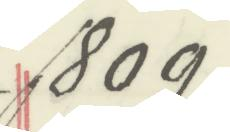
ƒ809
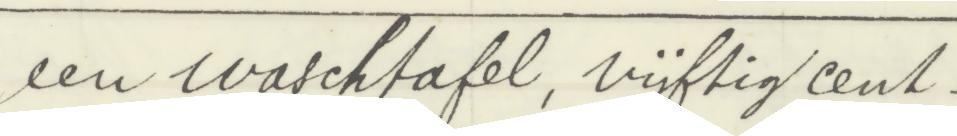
een waschtafel, vijftig cent
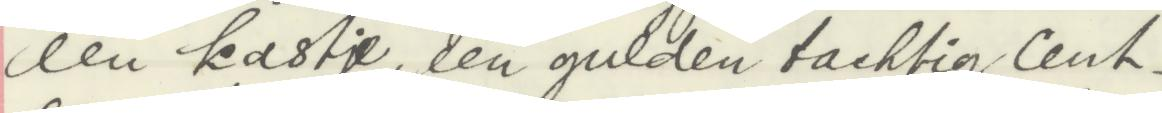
en kastje, een gulden tachtig cent
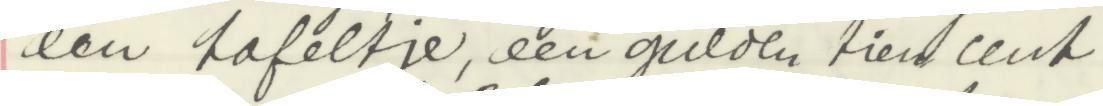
een tafeltje, een gulden tien cent
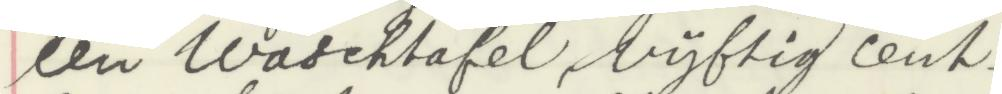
Een waschtafel, vijftig cent
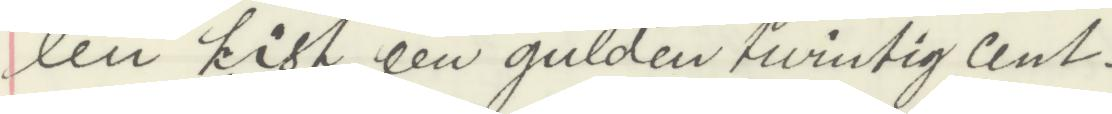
een kist, een gulden twintig cent
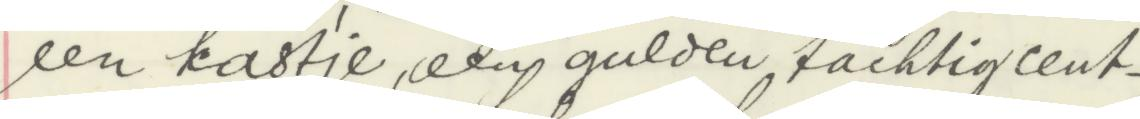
een kastje, een gulden, tachtig cent
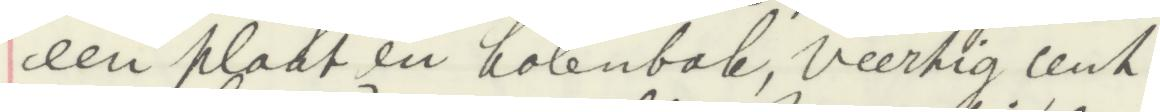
een plaat en kolenbak, veertig cent
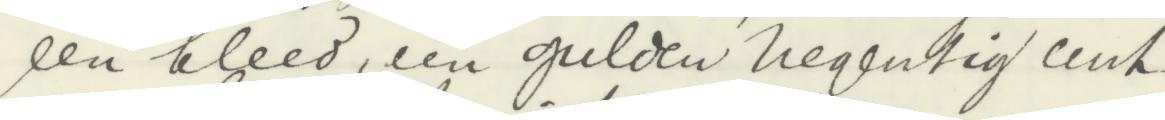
een kleed, een gulden negentig cent
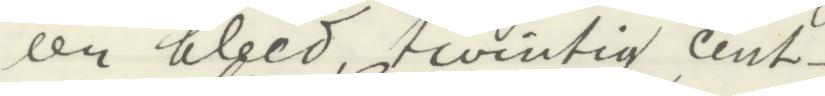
een kleed, twintig cent
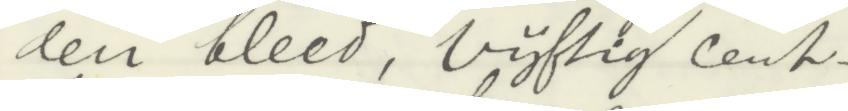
den kleed, vijftig cent
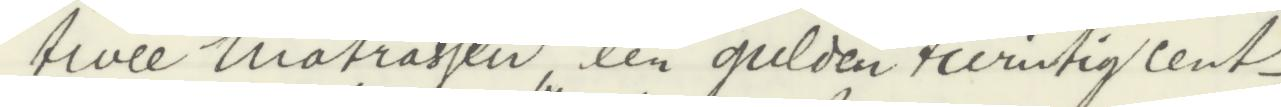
twee matrassen, een gulden twintig cent
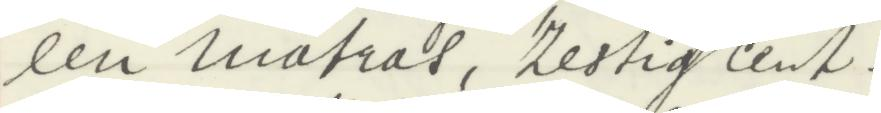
een matras, zestig cent
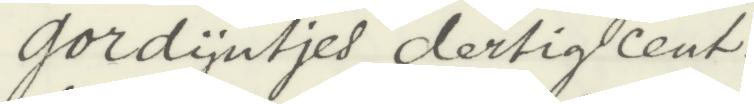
gordijntjes, dertig cent
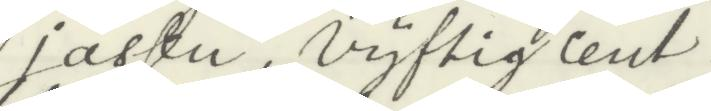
jassen, vijftig cent
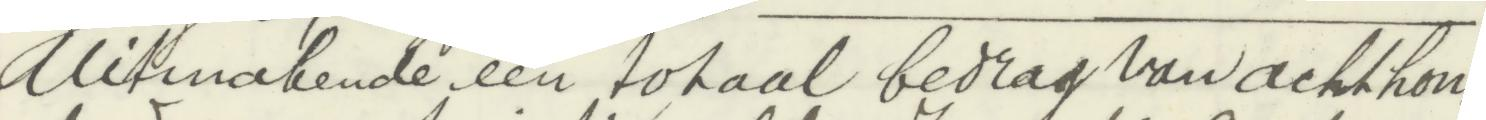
Uitmakende een totaal bedrag van acht hon
